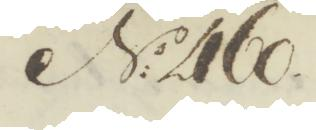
N:o 460.
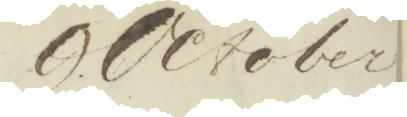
9. October
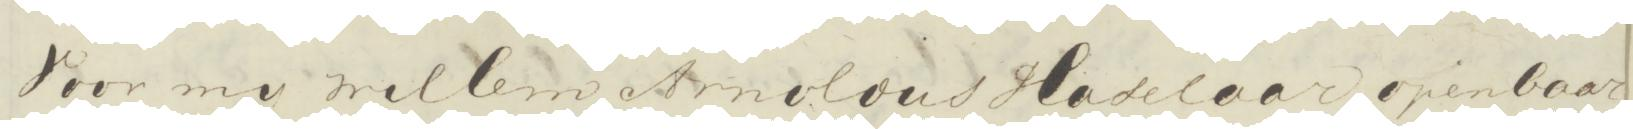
Voor my willem Arnoldus Haselaar, openbaar
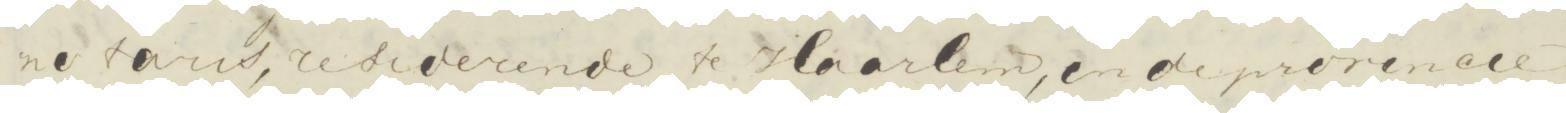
notaris, residerende te Haarlem, in de provincie
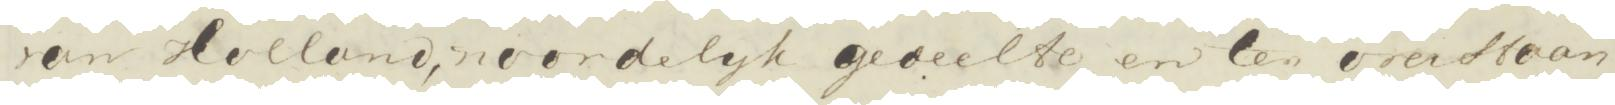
van Holland, noordelyk gedeelte en ten overstaan
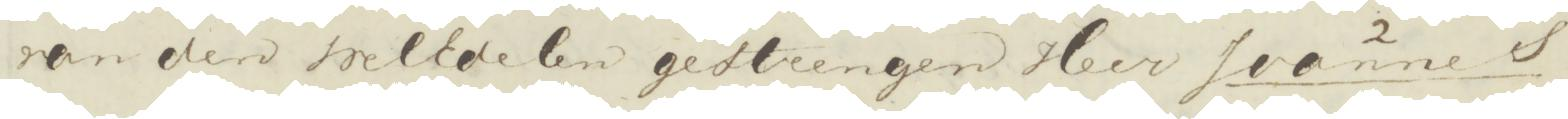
van den welEdelen gestrengen Heer Joannes
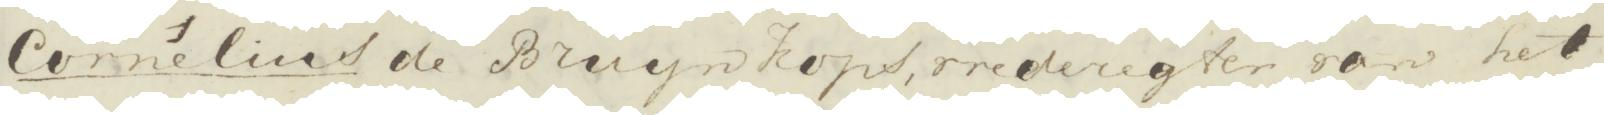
Cornelius de Bruyn Kops, vrederegter van het
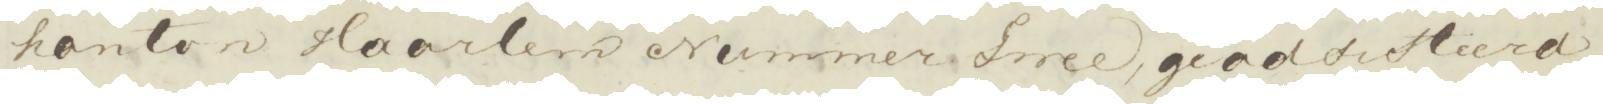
kanton Haarlem Nummer Twee, geadsisteerd
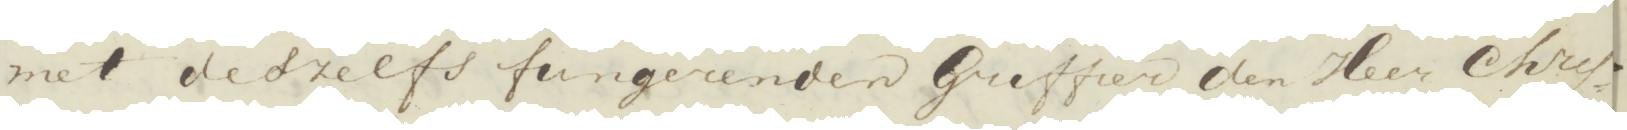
met deszelfs fungerenden Griffier den Heer Chris=
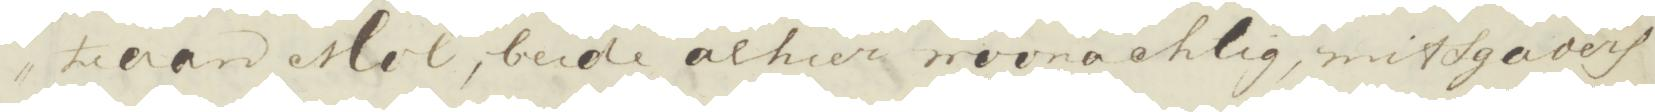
„tiaan Mol, beide alhier woonachtig, mitsgaders
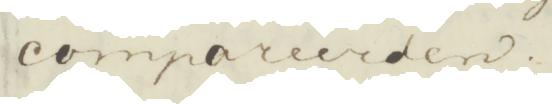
compareerden.
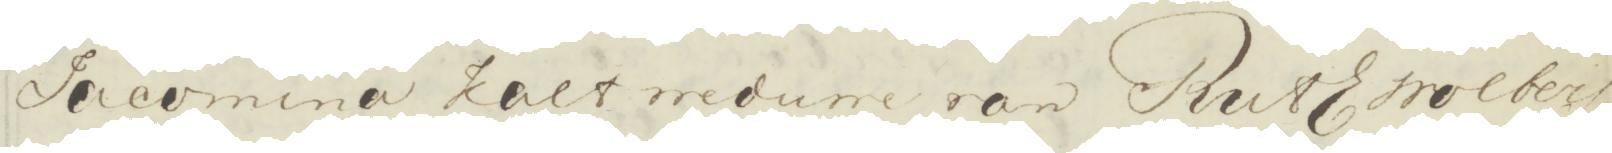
Iacomina Kalt weduwe van Ruth wolbers
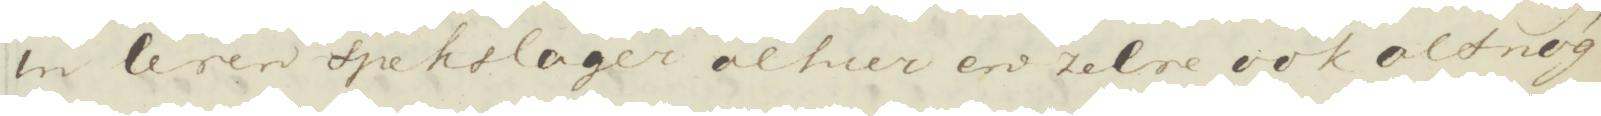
in leven spekslager alhier en zelve ook als nog
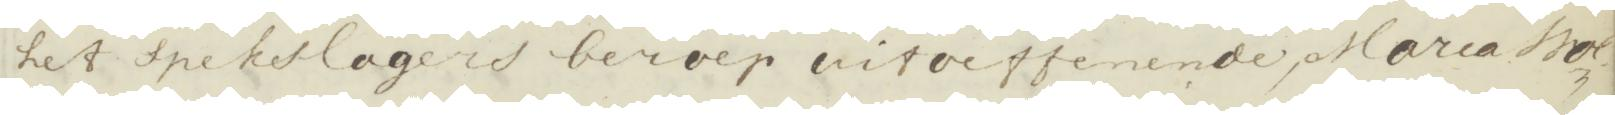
het spekslagers beroep uitoeffenende, Maria Wol„
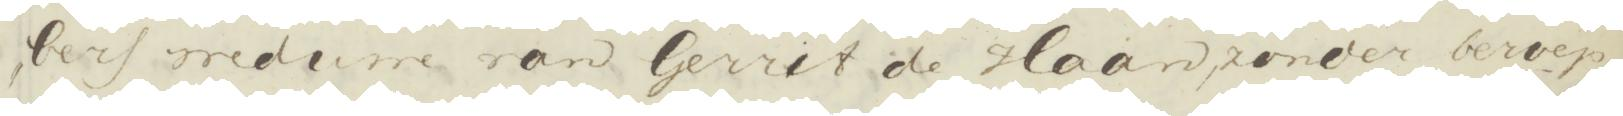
„bers weduwe van Gerrit de Haan, zonder beroep,
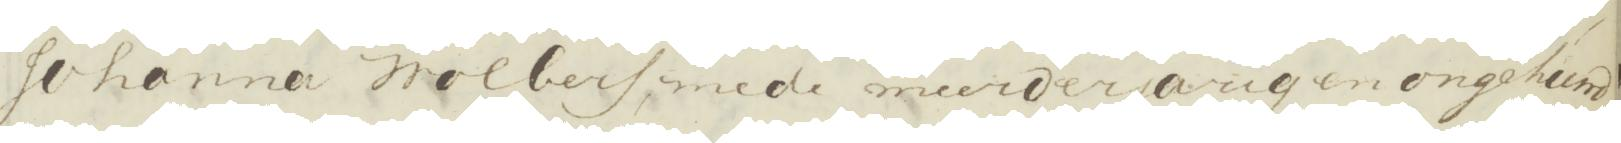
Johanna Wolbers mede meerderjarig en ongehuwd
